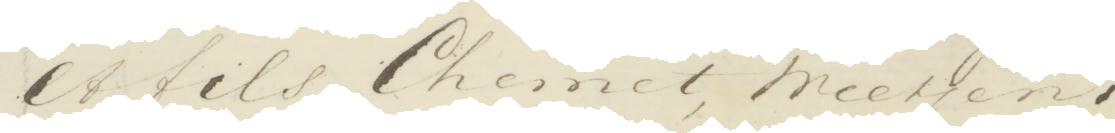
et fils, Chemet, weetjen,
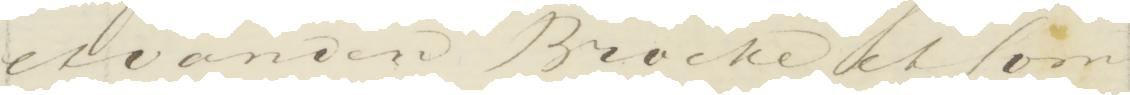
et van den Brocke et Com
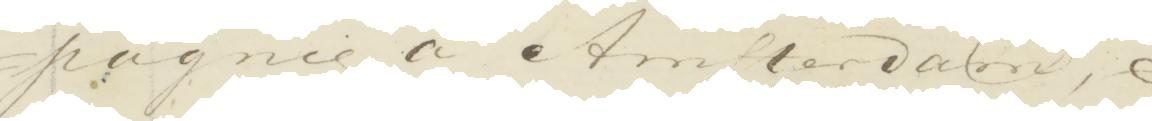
„pagnie à Amsterdam,
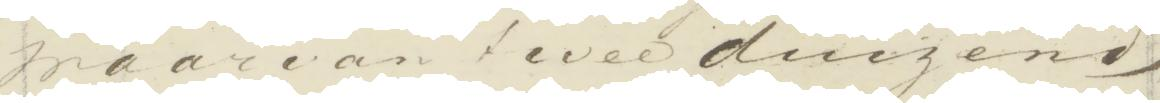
waarvan twee duizend
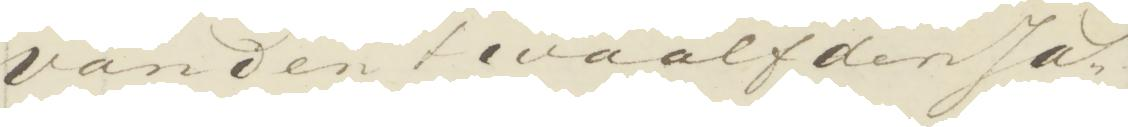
van den twaalfden Ja„
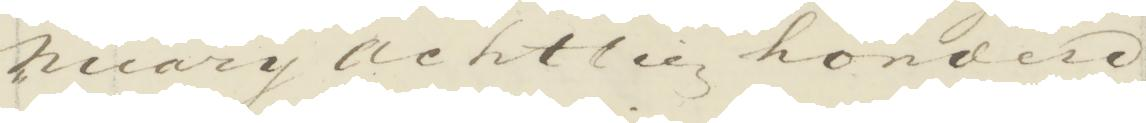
„nuary Achttien honderd
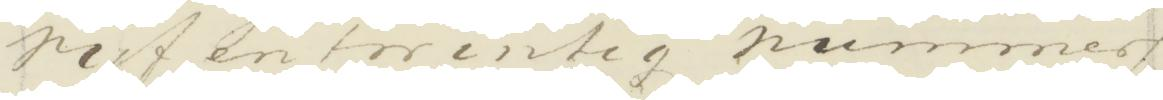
Vyf en twintig Nummers
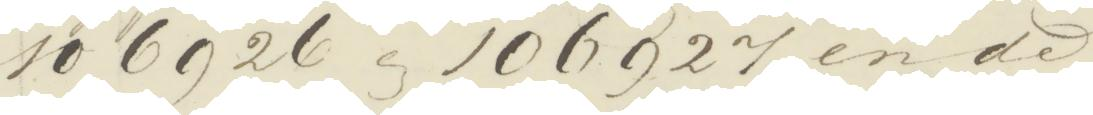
106926 en 106927 en de
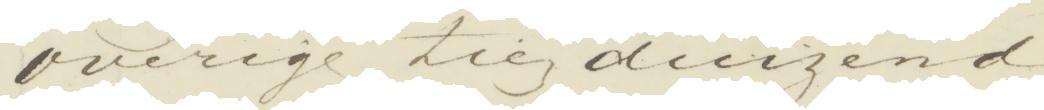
overige tien duizend
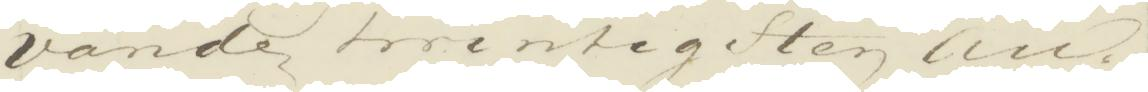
van den twintigsten au
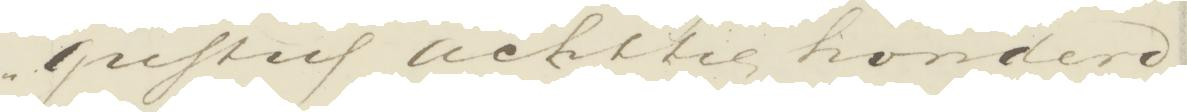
„gustus achttien honderd
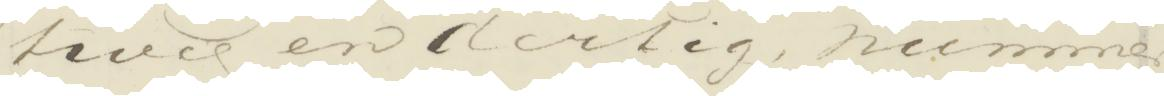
twee en dertig, Nummero
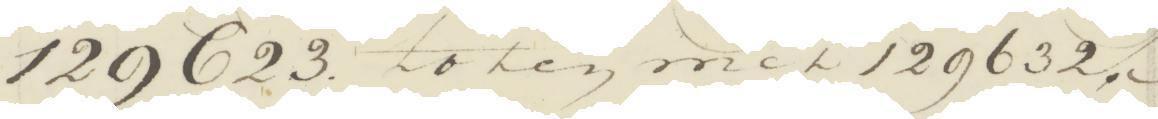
129623. toten met 129632. —
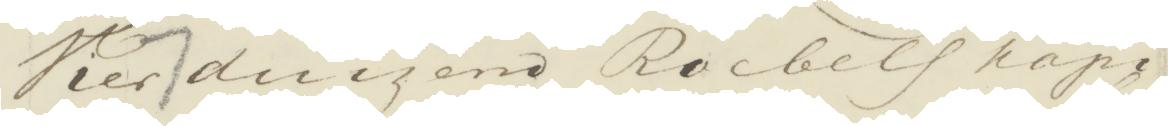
Vier duizend Roebels kapi
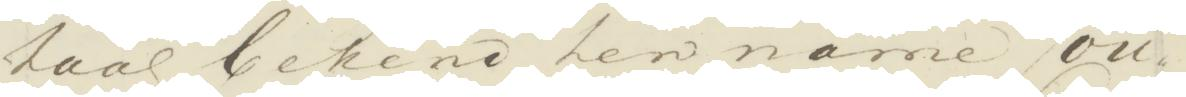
taal bekend ten name Cou„
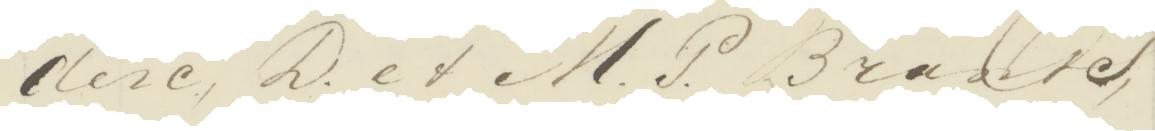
dere, D. et M. P. Brants,
